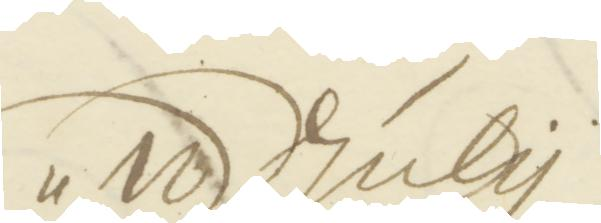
„ 18 Julij
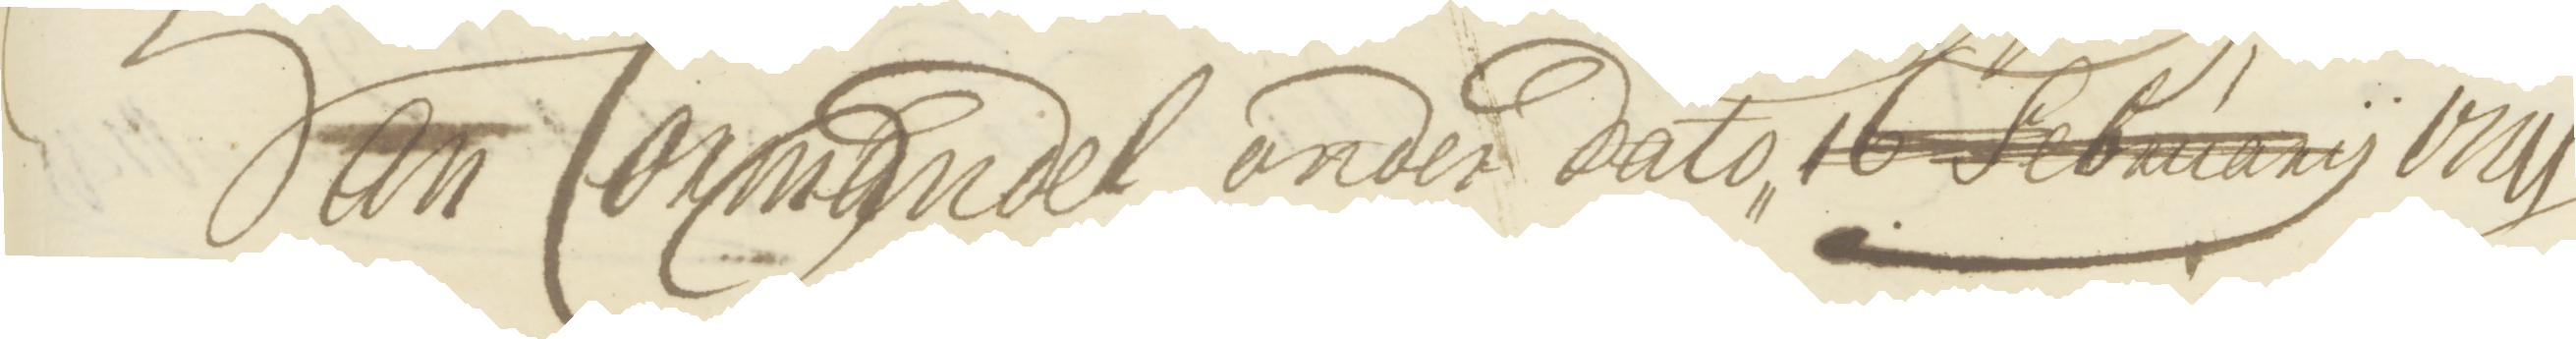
Van Cormandel onder dato „ 16 februarij 1741
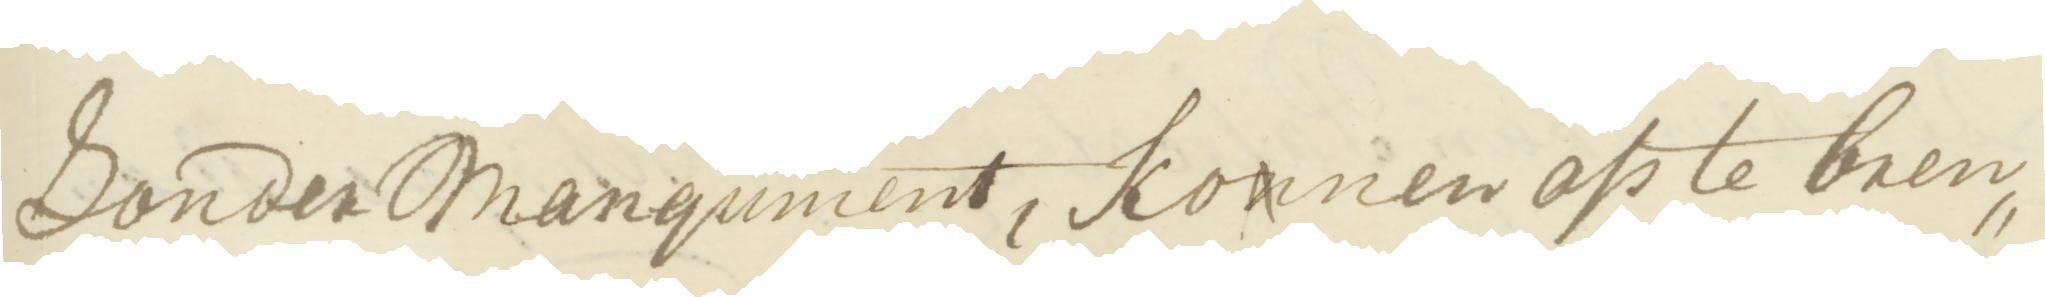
zonder Manqument, konnen op te bren„
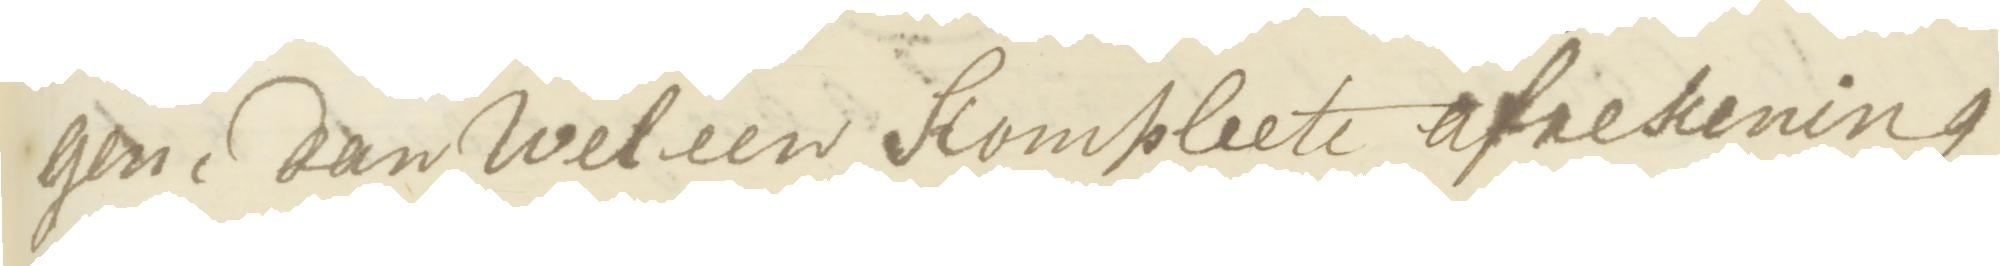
gen, dan wel een kompleete afrekening
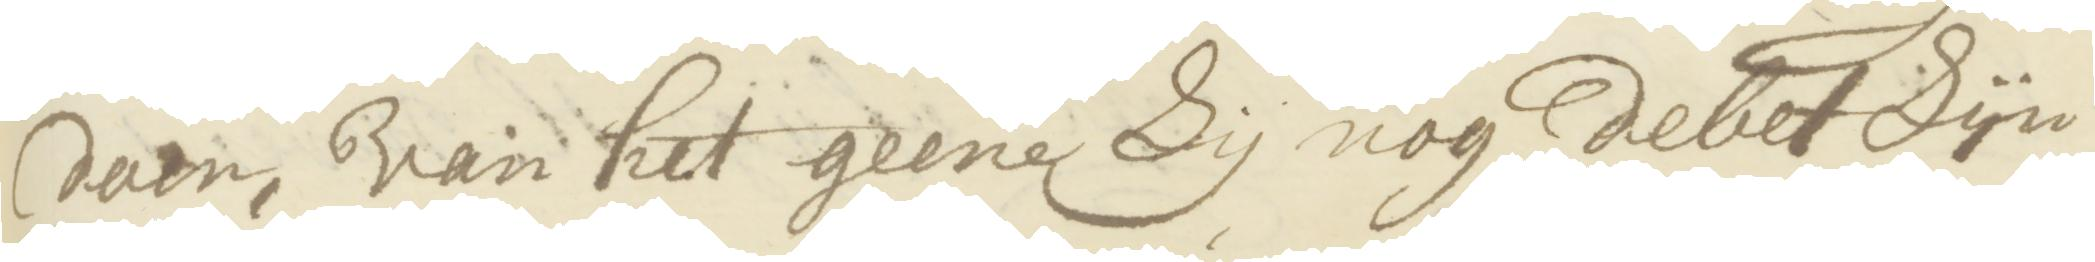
doen, van het geene zij nog debet zijn
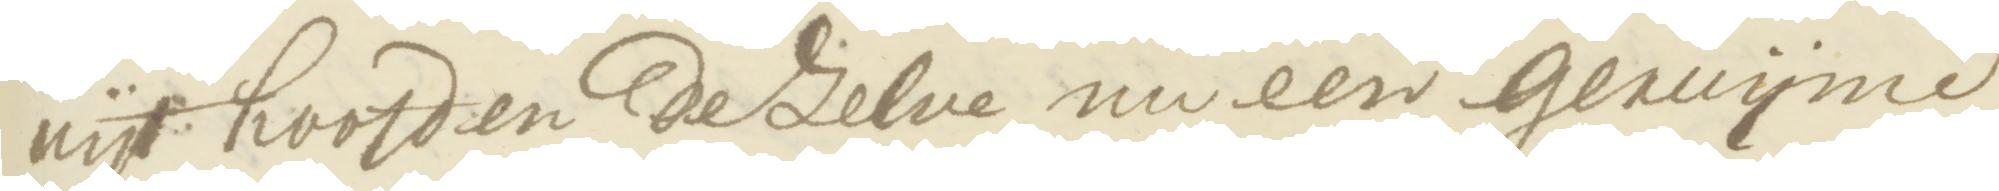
uijt hoofden dezelve nu een geruijme
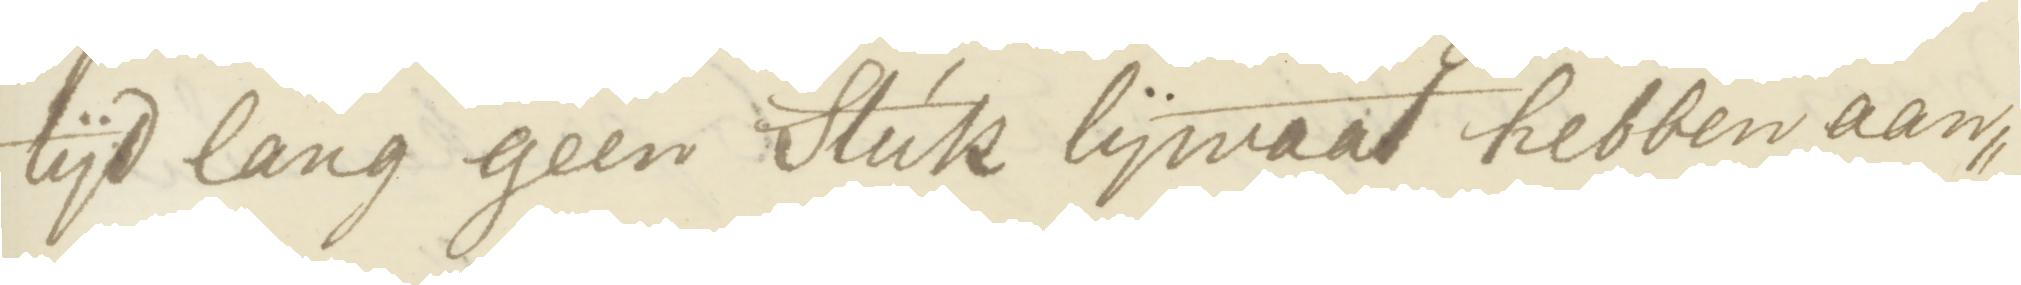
tijd lang geen stuk lijwaat hebben aan„
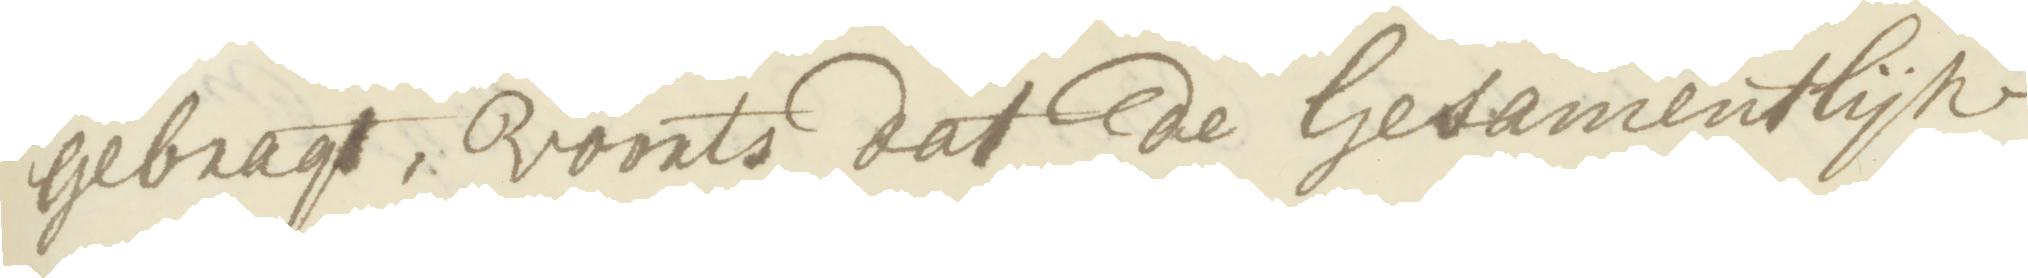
gebragt, voorts dat de Gesamentlijk
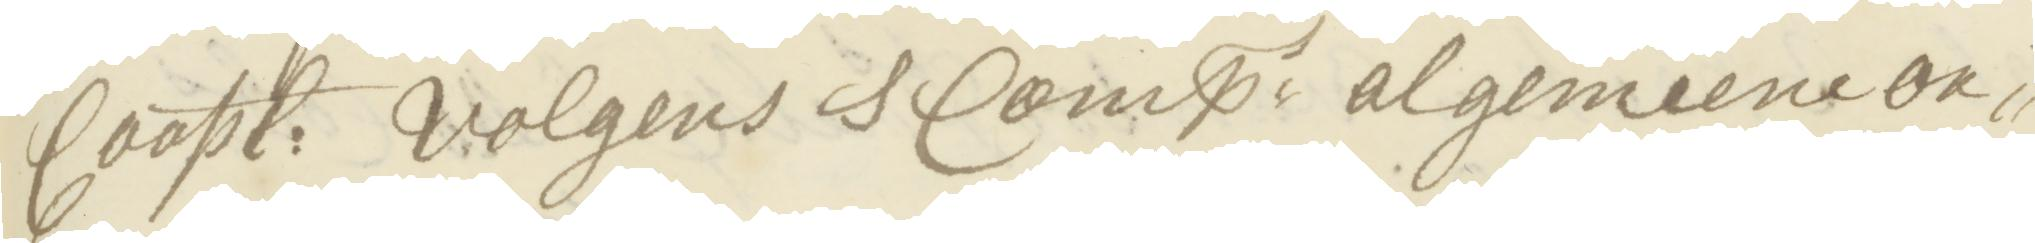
Coopl: volgens s Comp„s algemeene or„
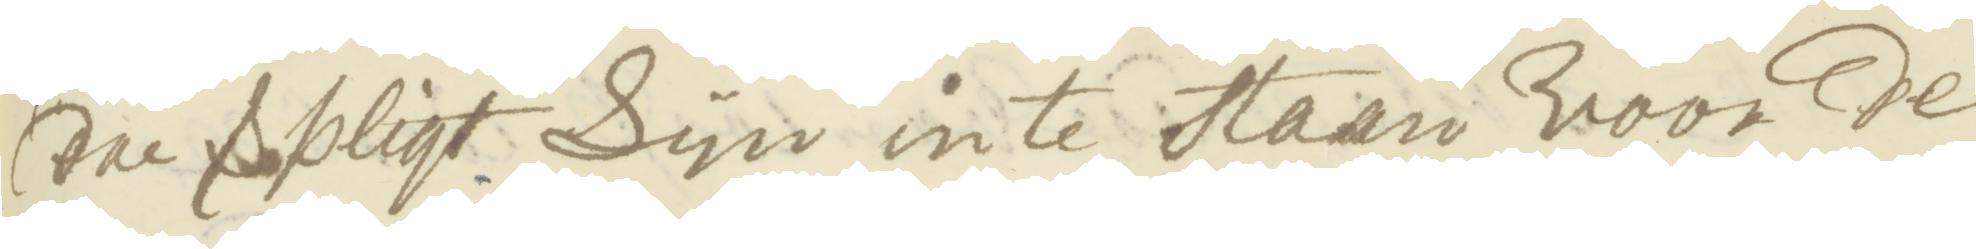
dre verpligt sijn in te staan voor de
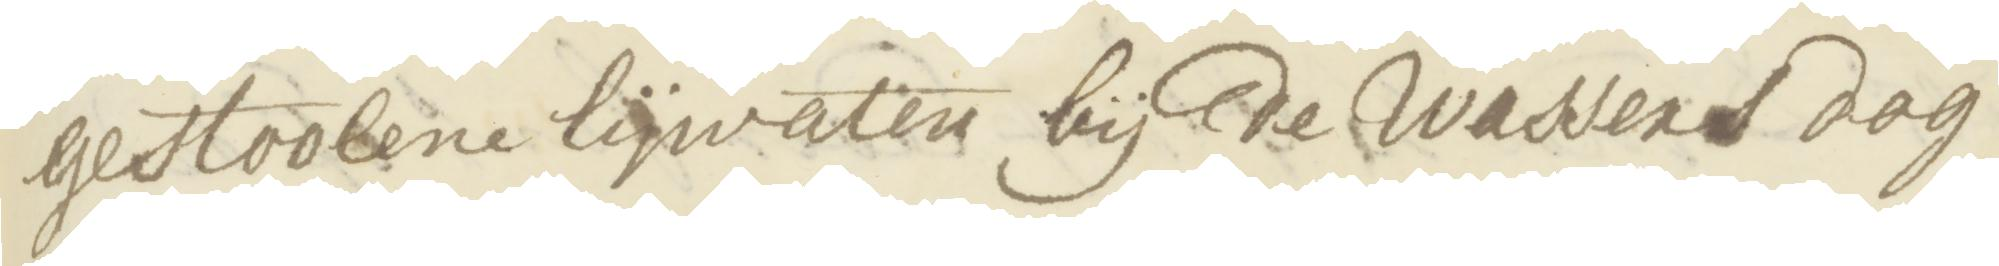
gestoolene lijwaten bij de wassers dog
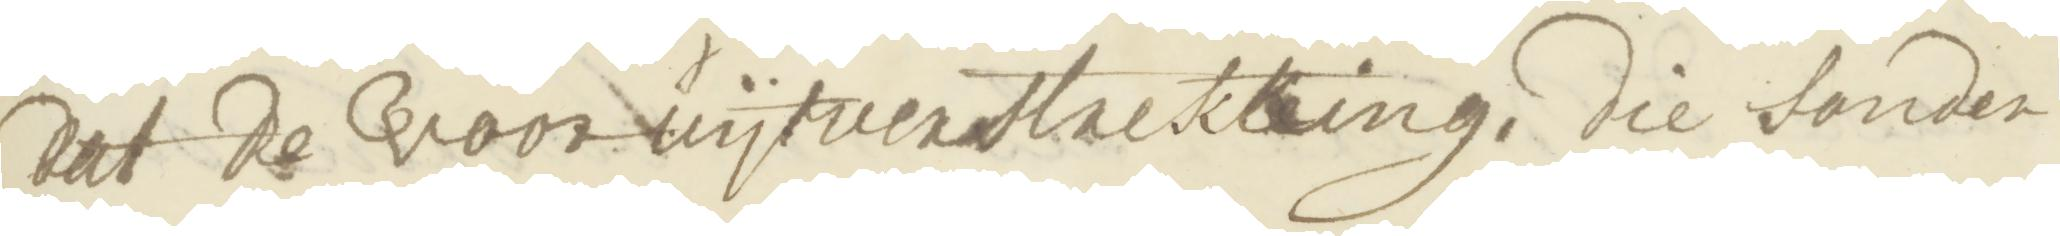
dat de vooruijtverstrekking, die sonder
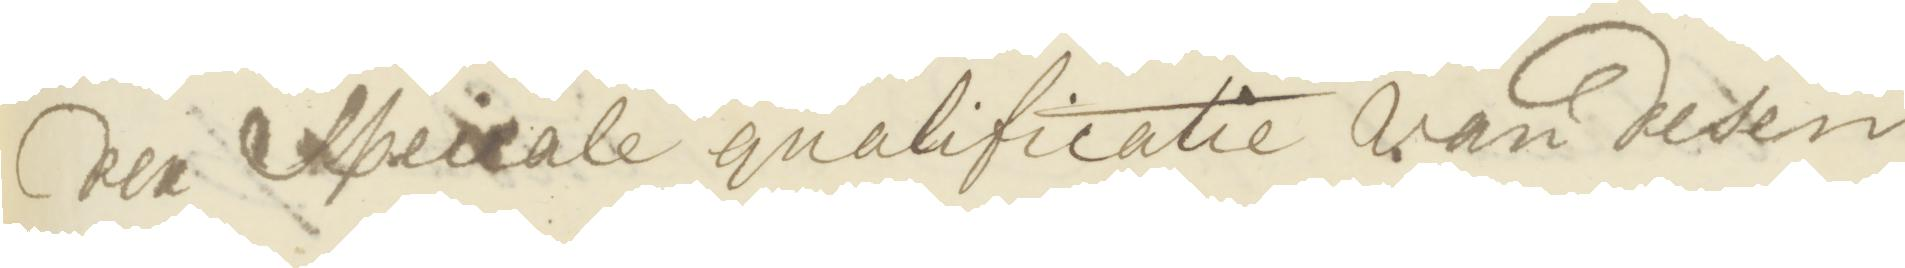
der speciale qualificatie van desen
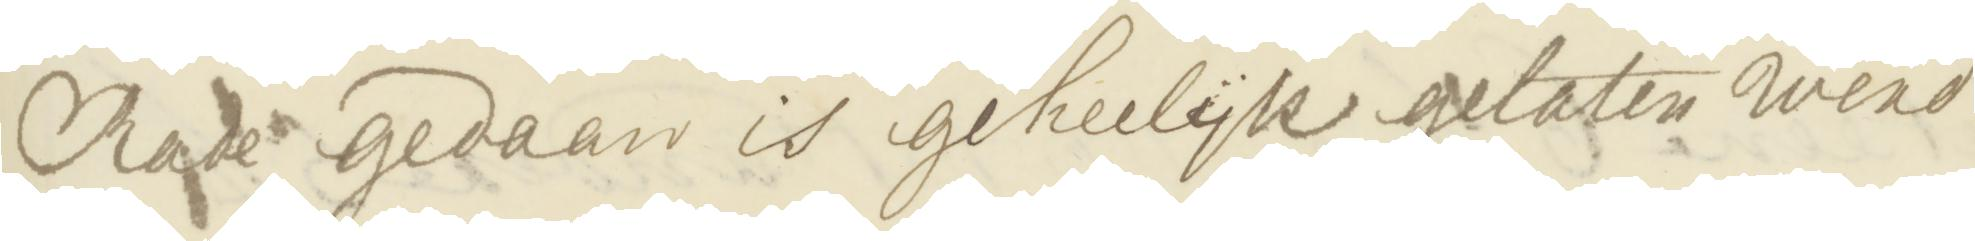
Rade gedaan is geheelijk gelaten werd
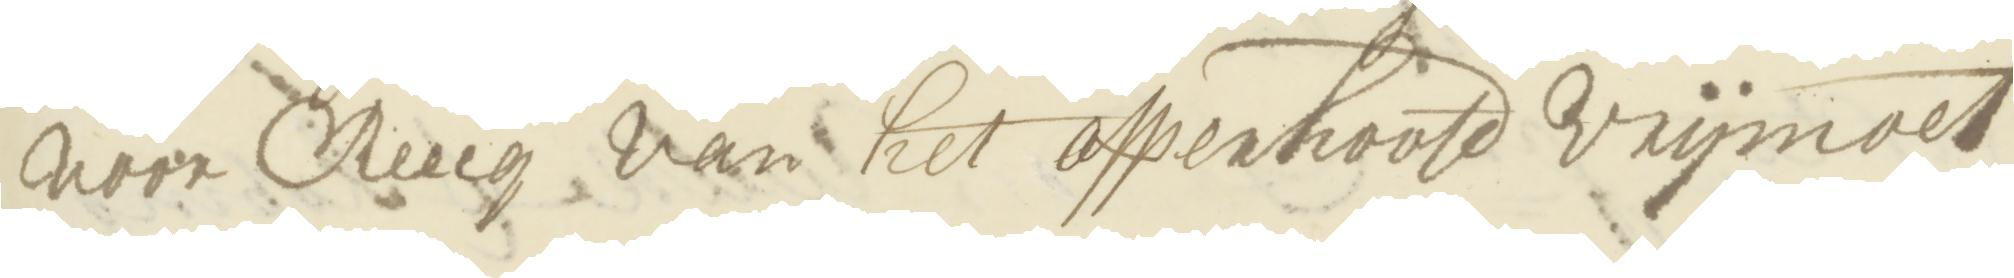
voor Reecq van het opperhoofd vrijmoet
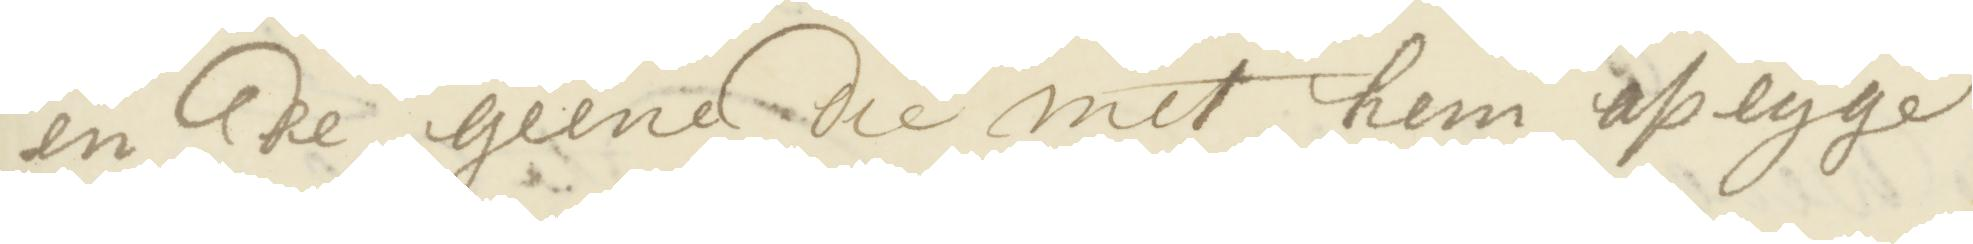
en de geene die met hem op eijge
